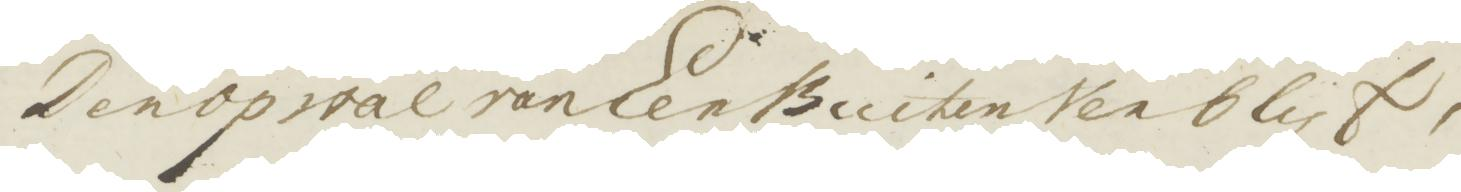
Den opwal van Een Buiten verblijf,
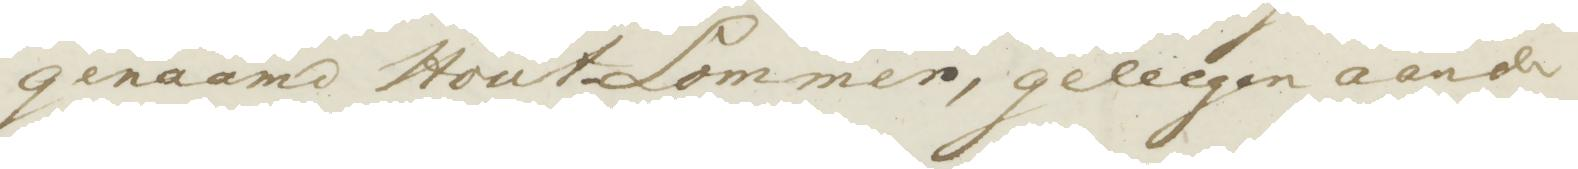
genaamd Hout Lommer, geleegen aan de
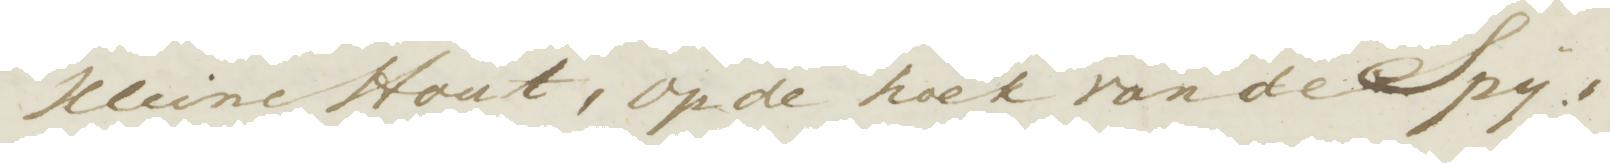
kleine Hout, op de hoek van de Spij„
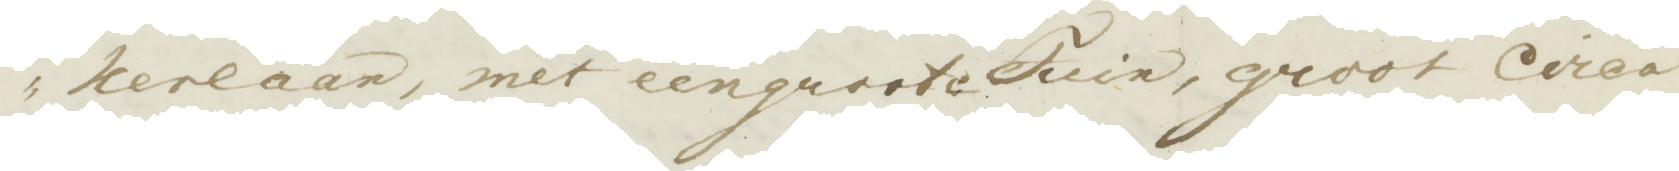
„kerlaar, met een groote Tuin, groot circa
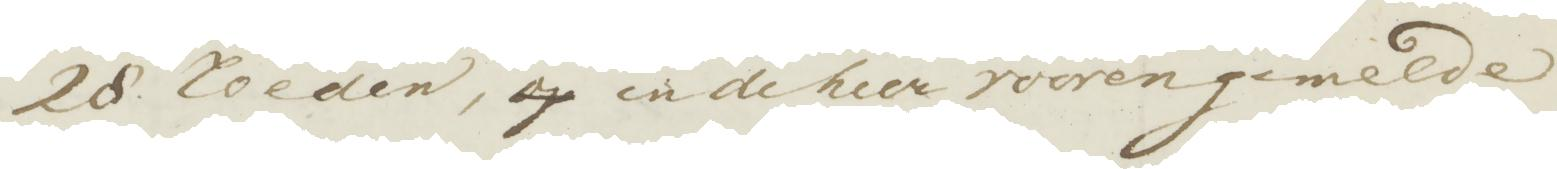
28. roeden, op in de hier vooren gemelde
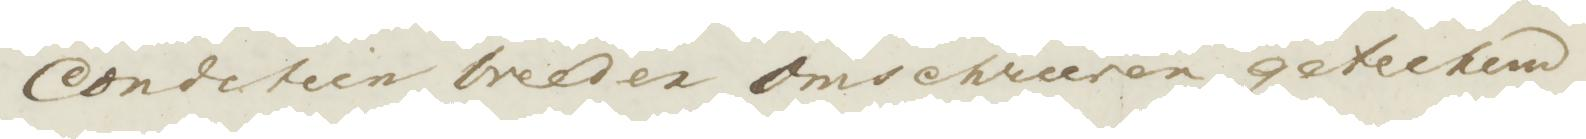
conditien breeder omschreeven, geteekend
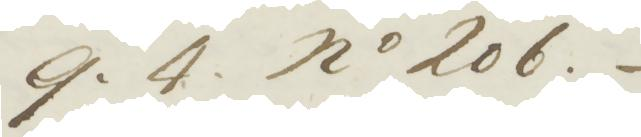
9. 4. No 206. -
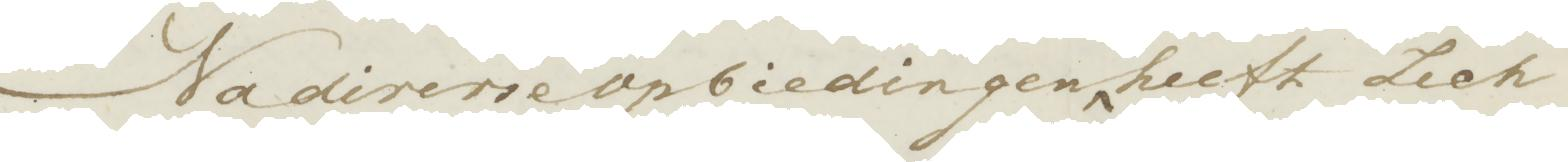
Na diverse opbiedingen heeft zich
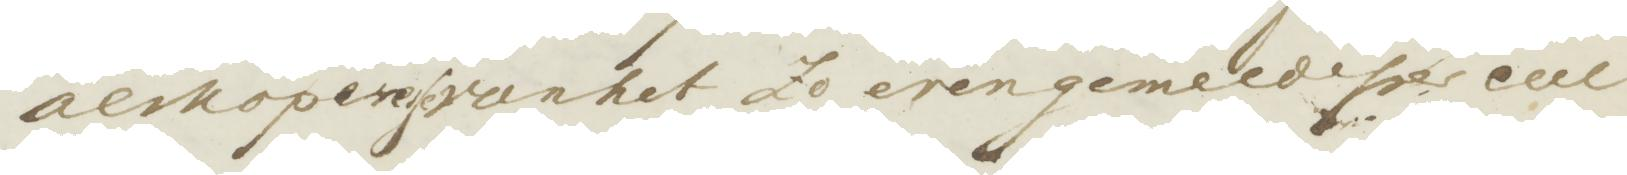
als koperes van het zo even gemeede perceel
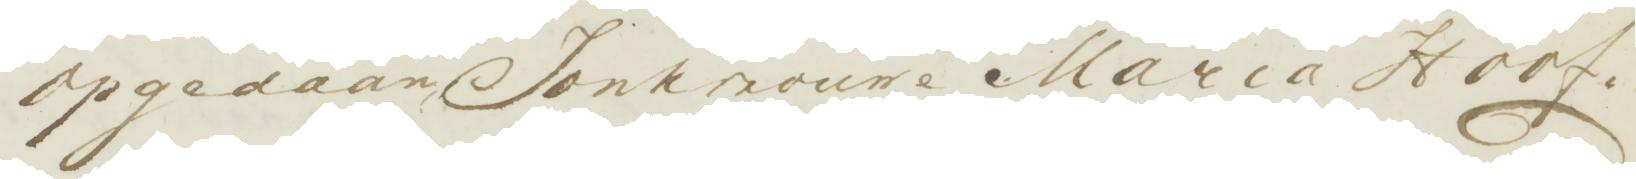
opgedaan Jonkvrouwe Maria Hoof„
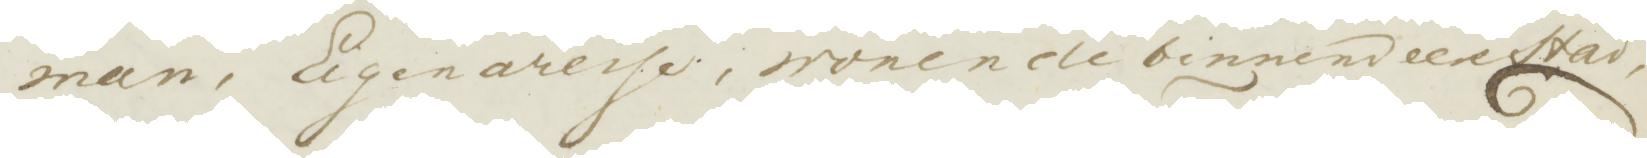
man, Eigenaresse, wonende binnen deese stad,
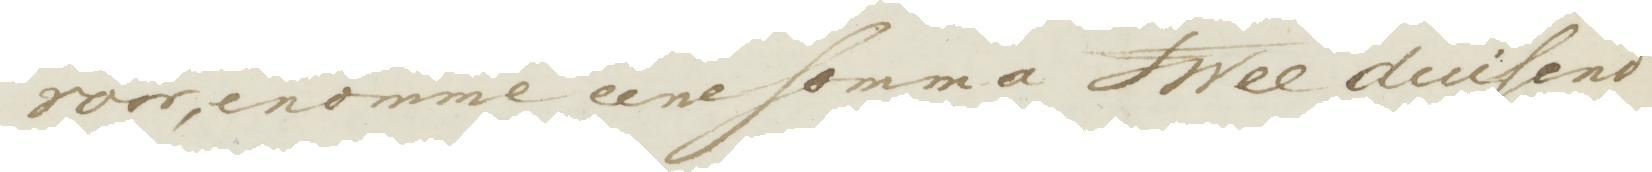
voor, en omme eene somma twee duisend
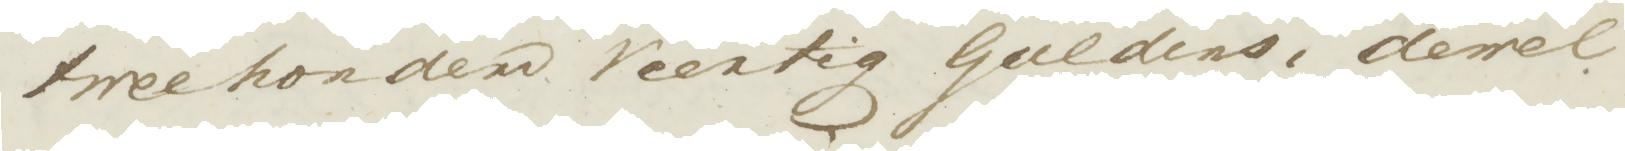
tweehonderd veertig guldens, dewel„
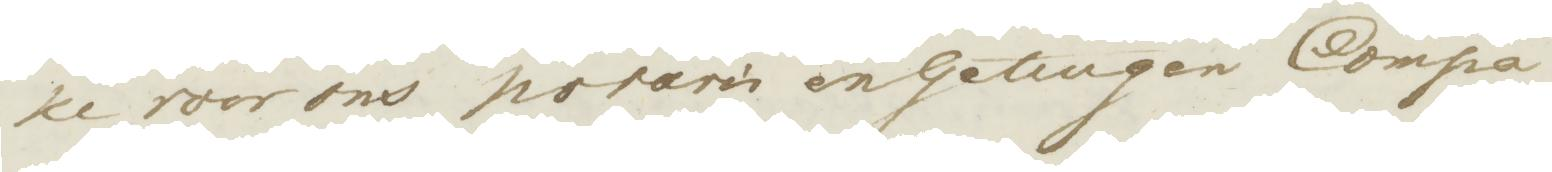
ke voor ons notaris in getuigen Compa
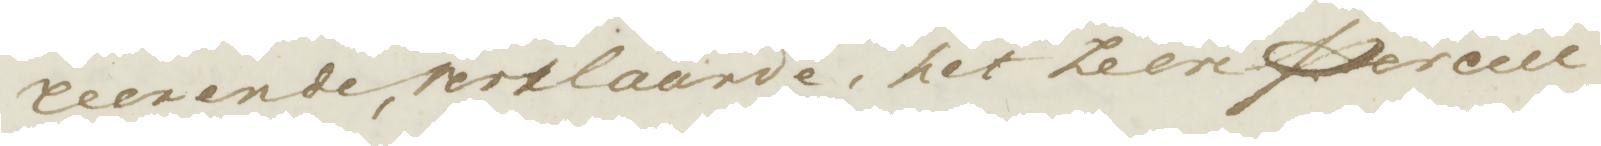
reerende, verklaarde, het zelve perceel
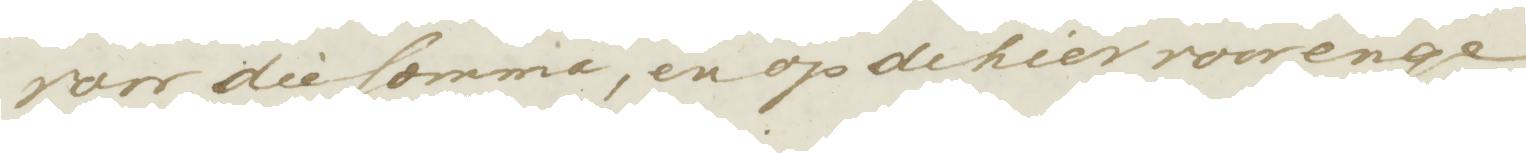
van die somme, en op de hier vooren ge
